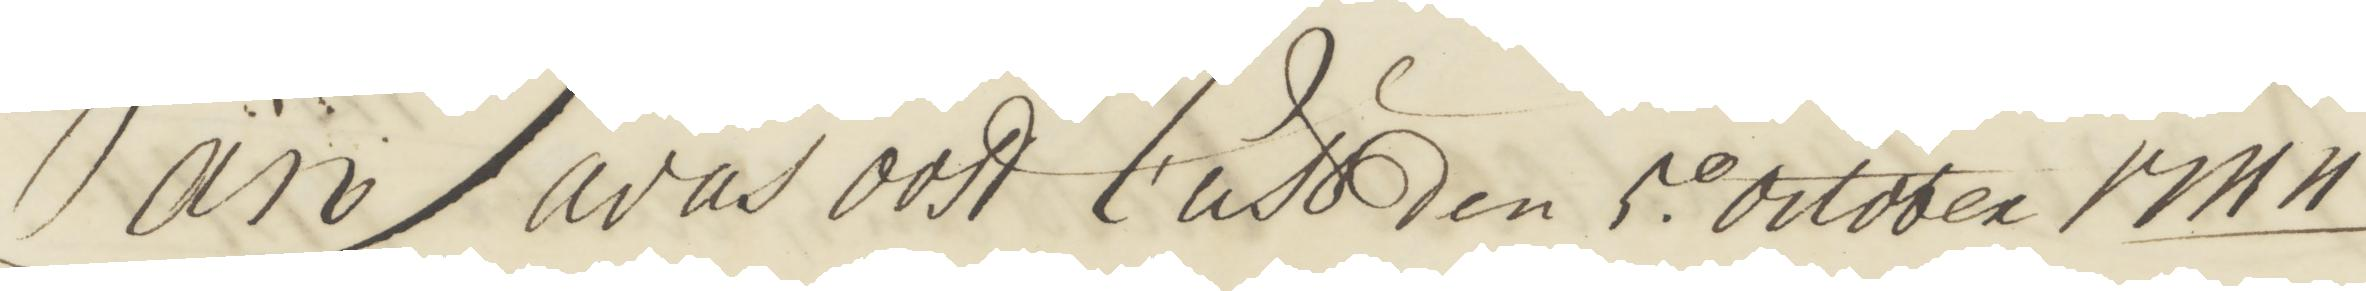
Van Javas oost Cust den 5:e october 1744
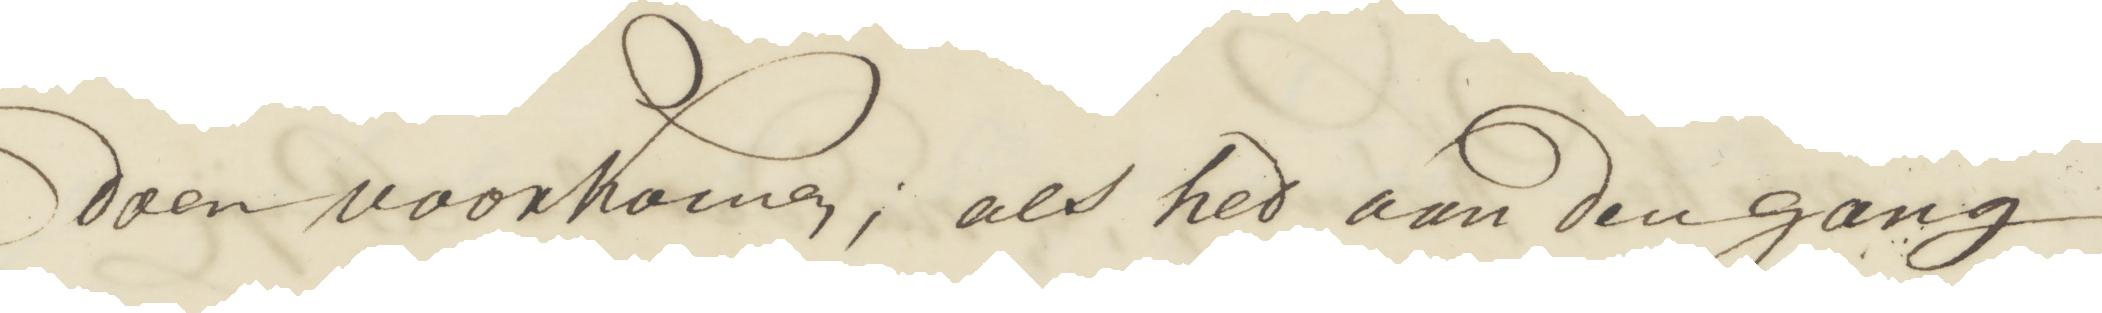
doen voorkomen; als het aan den gang
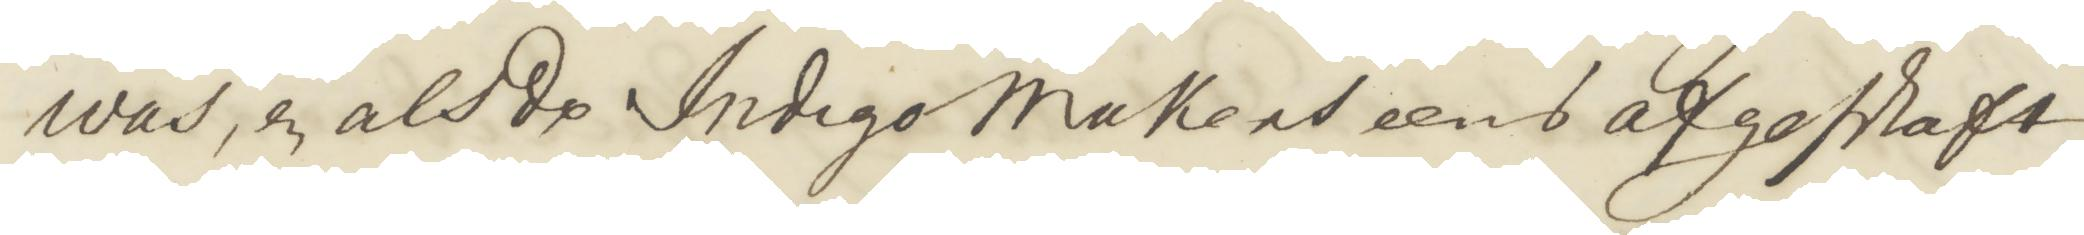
was, en als de Jndigomakers eens afgeschaft
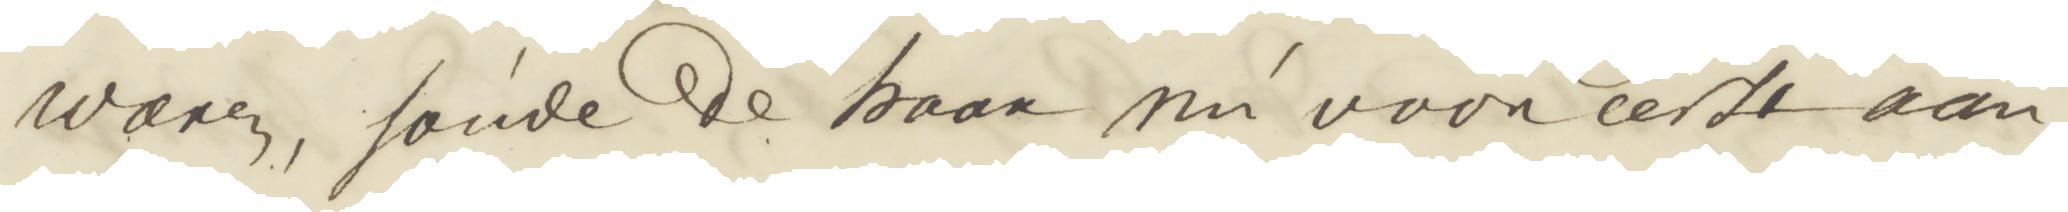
waren, soude de haar nu voor eerst aan
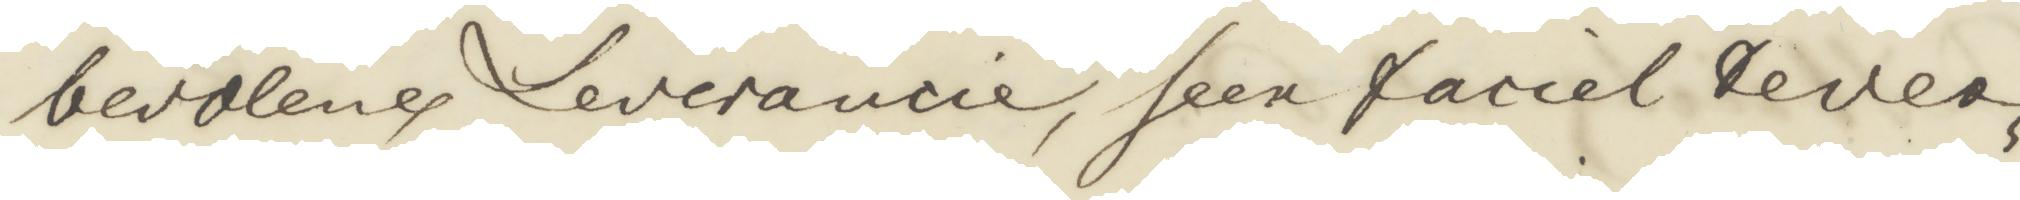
bevolene Leverancie, seer faciel tever
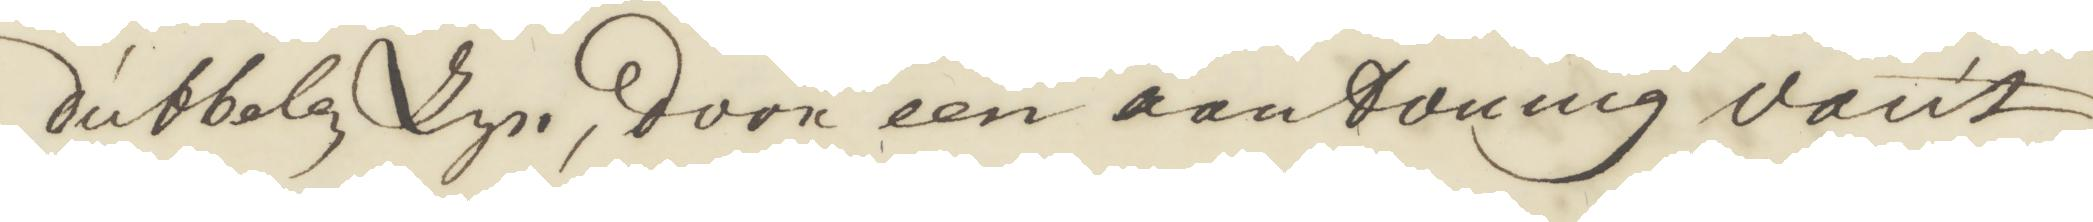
dubbelen zyn, door een aantoning van’t
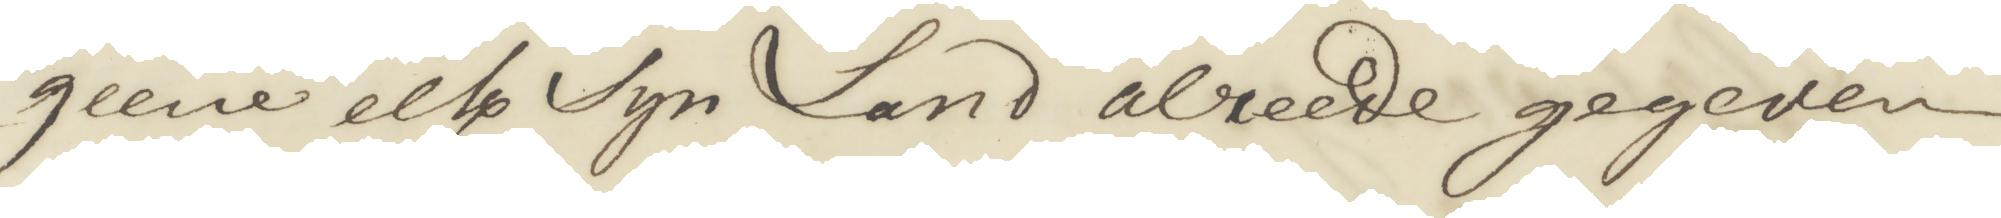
geene elk syn Land alreede gegeven
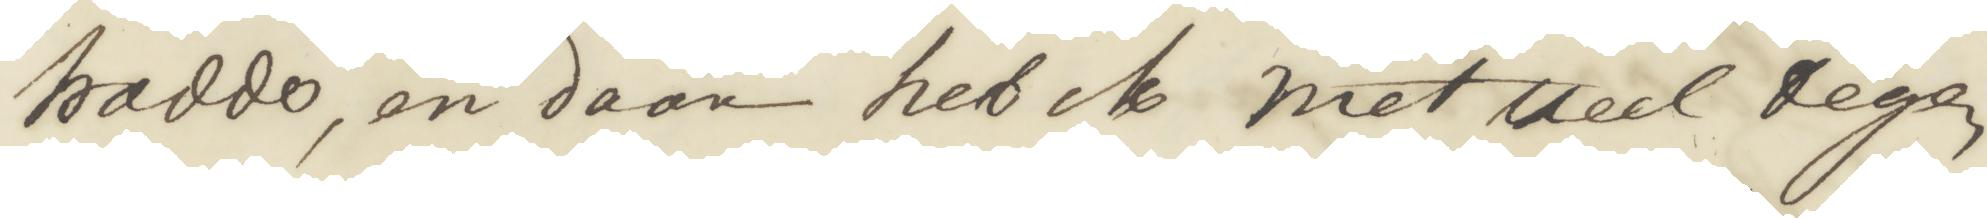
hadde, en daar heb ik niet veel tegen
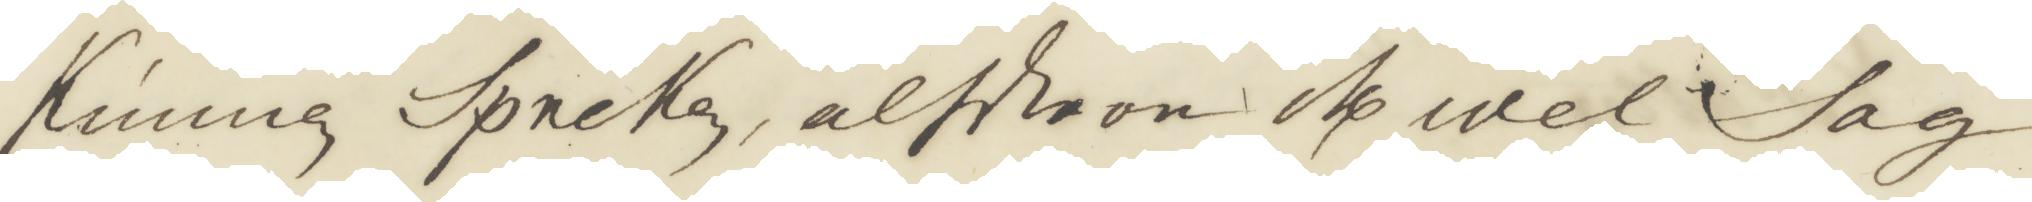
kunnen spreken, alschoon op wel sag
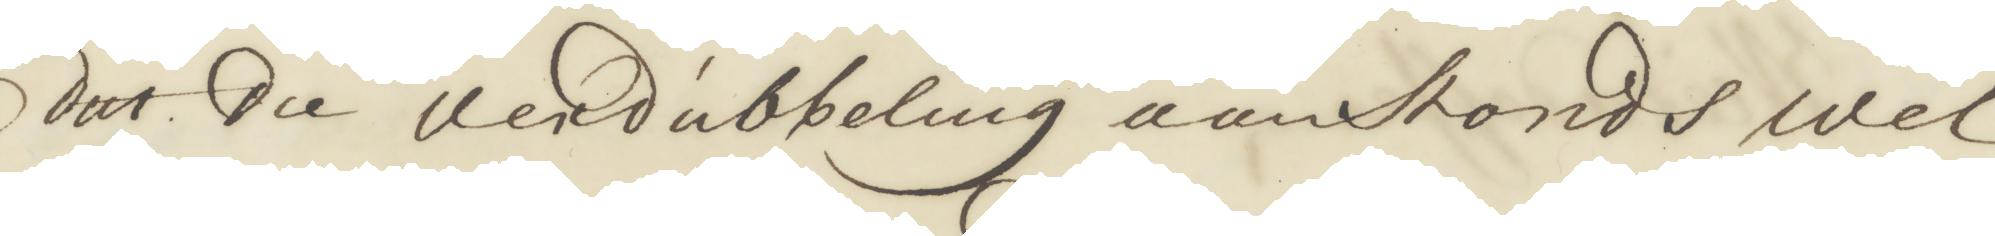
dat die verdubbeling aanstonds wel
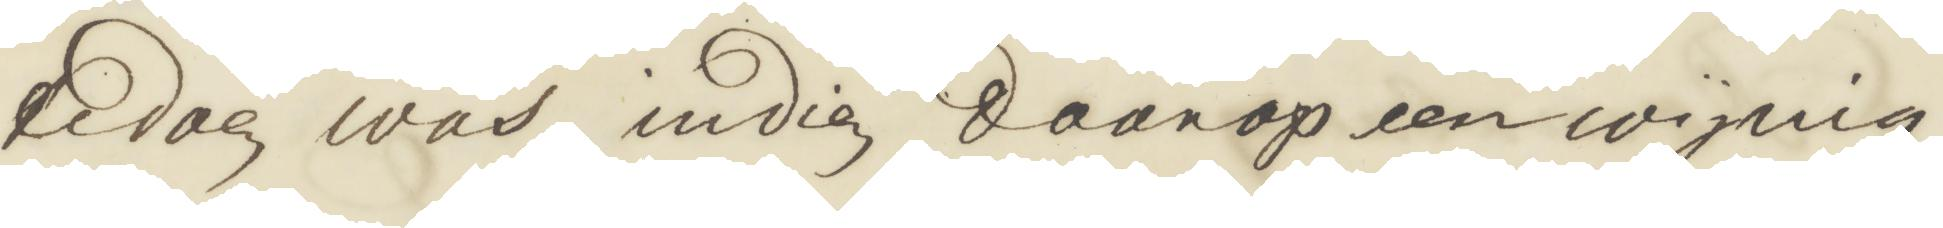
tedoen was, indien daarop een wijnig
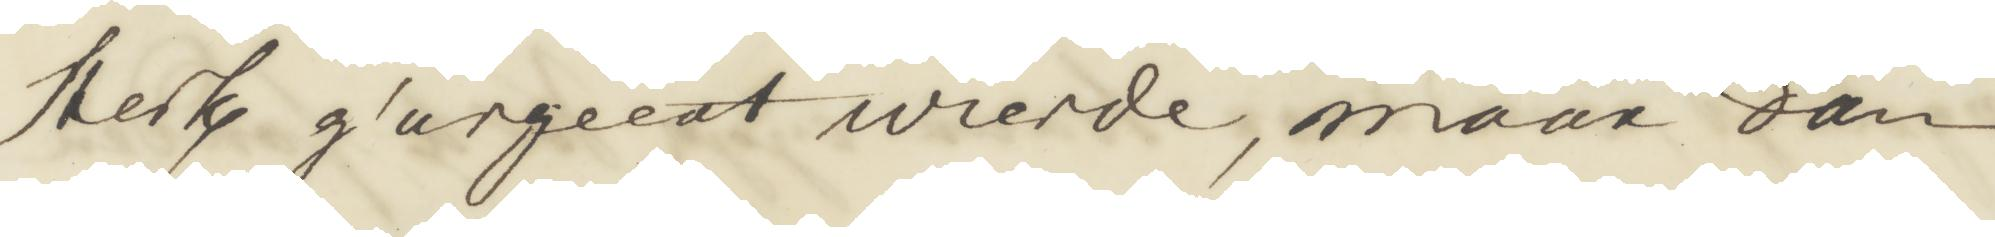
sterk g'urgeert wierde, maar dan
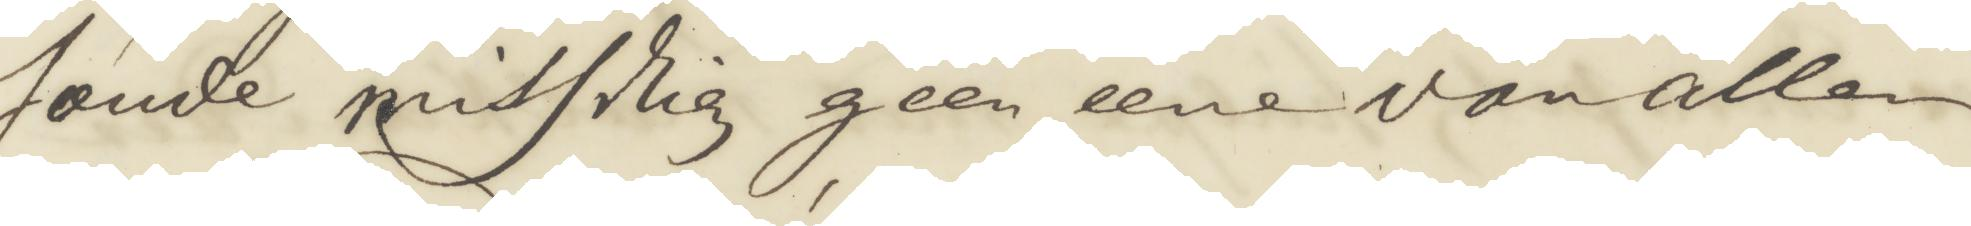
soude misschien geen eene van allen
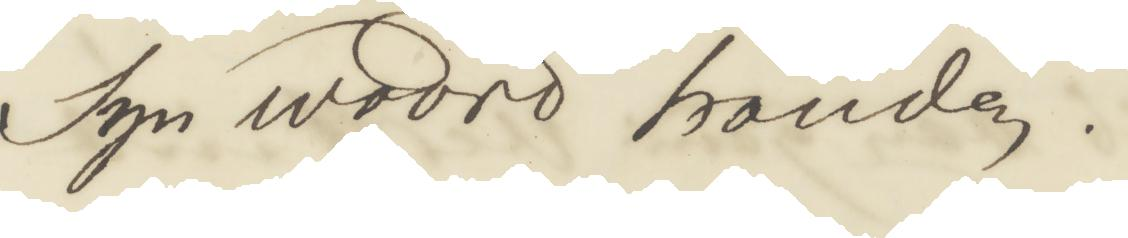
syn woord houden.
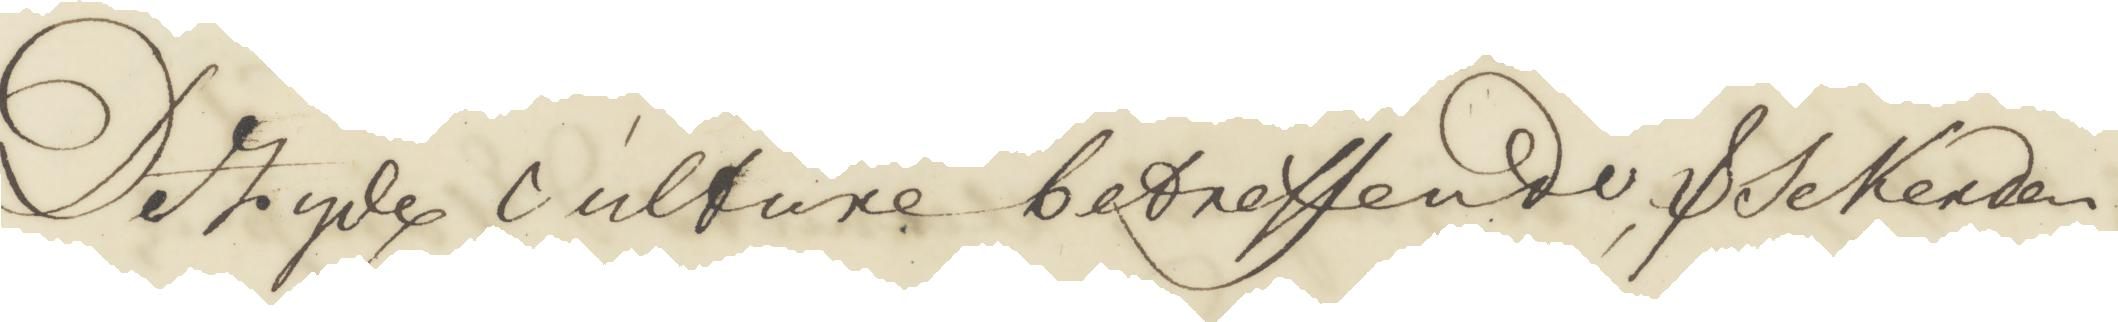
De zyde culture betreffende, versekerden
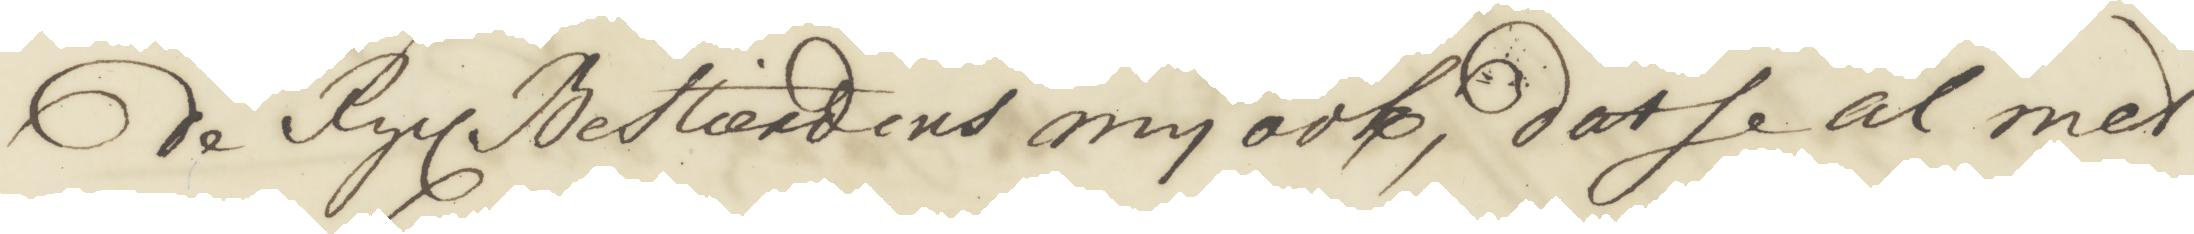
de Ryx Bestierdens my ook, datse al met
